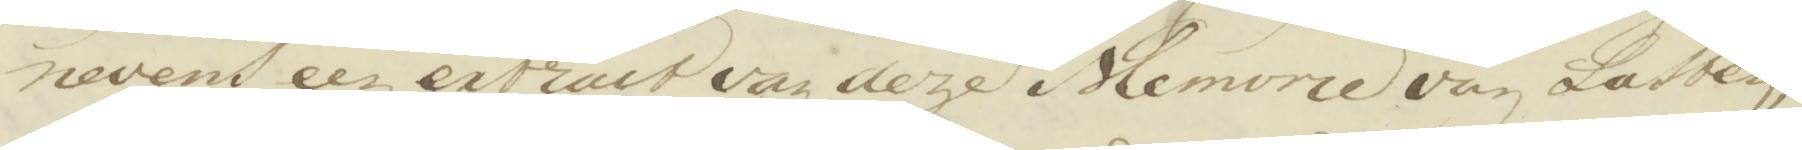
nevens een extract van deze Memorie van Lasten,
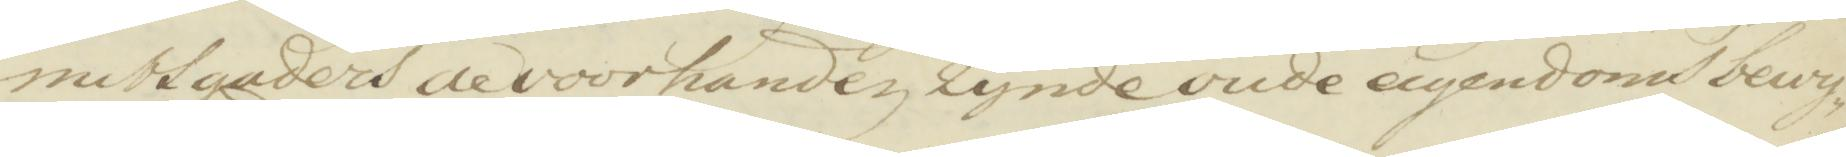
mitsgaders de voorhanden zynde oude eigendoms bewy„
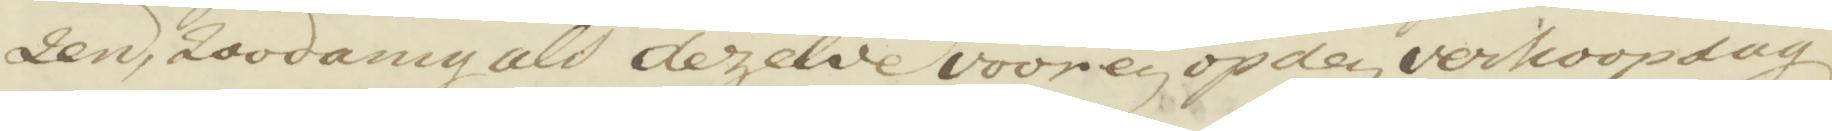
zen, zoodanig als dezelve voor en op den verkoopdag
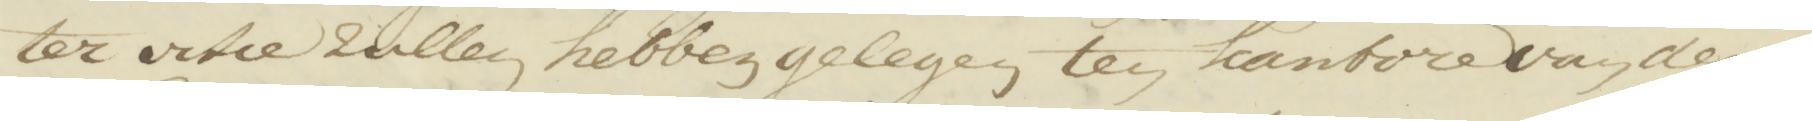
ter visie zullen hebben gelegen ten kantore van den
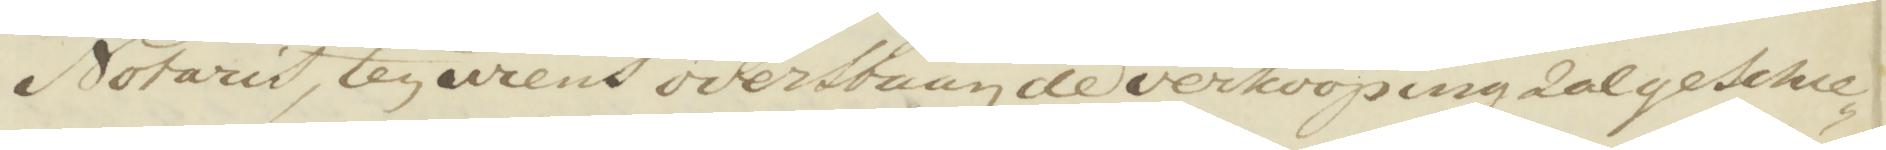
Notaris, ten wiens overstaan de verkooping zal geschie„
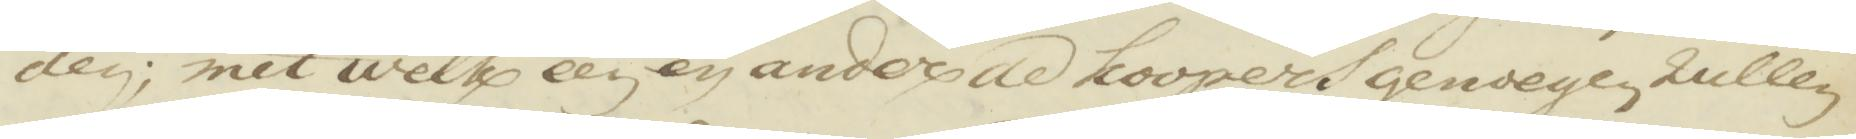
den; met welk een en ander de koopers genoegen zullen
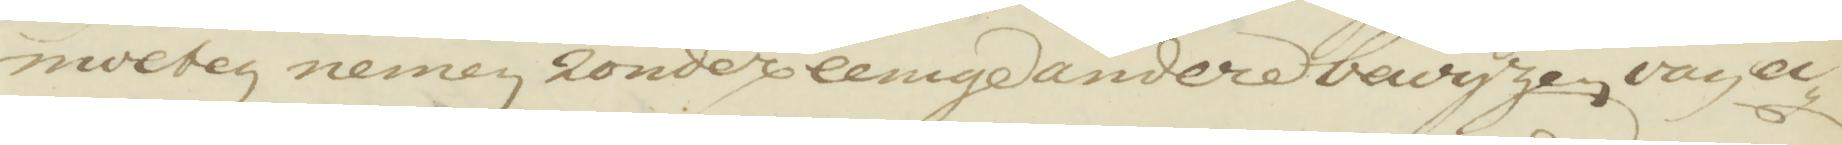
moeten nemen zonder eenige andere bewijzen van ei„
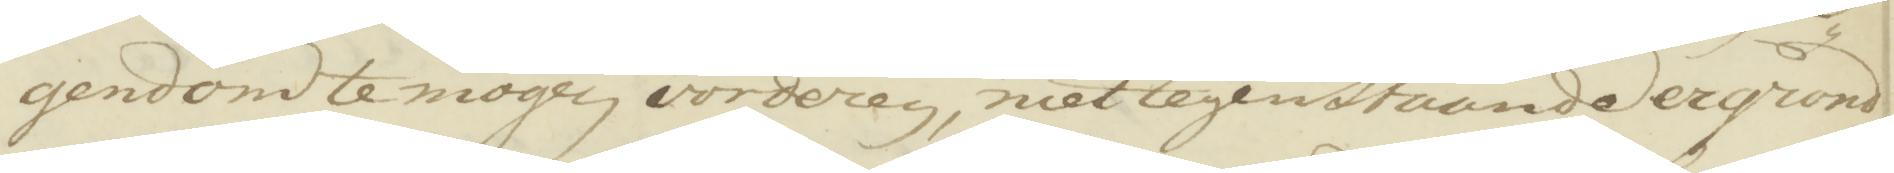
gendom te mogen vorderen, niet tegenstaande er grond
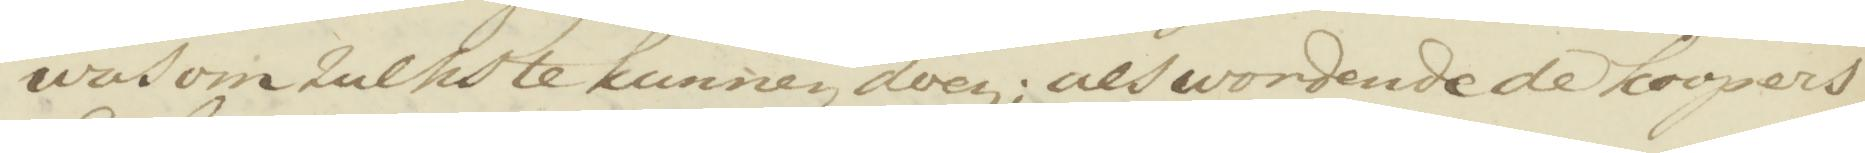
was om zulks te kunnen doen; als wordende de koopers
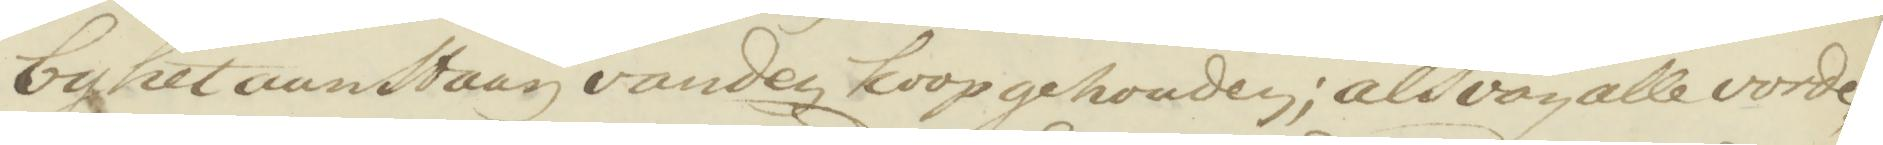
by het aanstaan van den koop gehouden; als van alle vorde
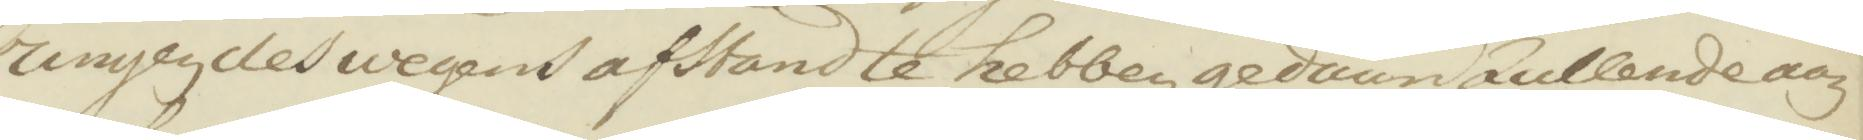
ringen des wegens afstand te hebben gedaan zullende aan
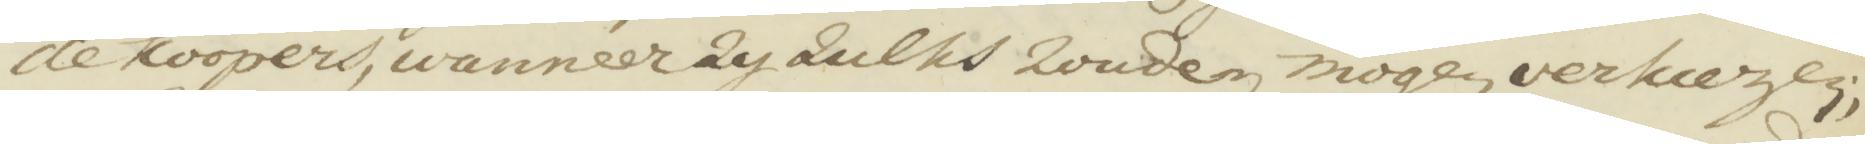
de koopers, wanneer zy zulks zouden mogen verkiezen,
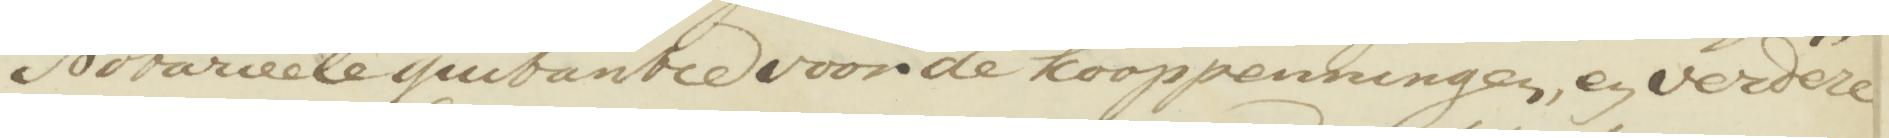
Notarieele quitantie voor de kooppenningen, en verdere
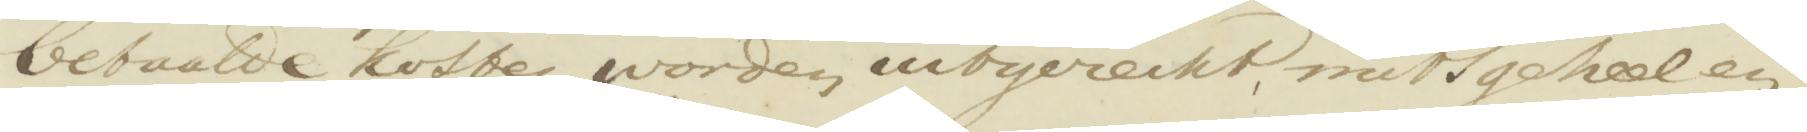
betaalde kosten worden uitgereikt, mits geheel en
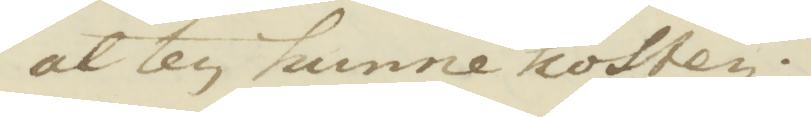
al ten hunne kosten.
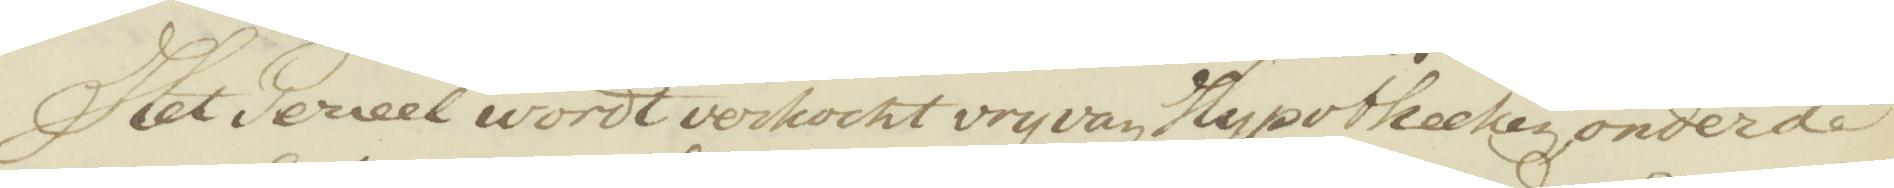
Het Perceel wordt verkocht vry van Hypotheeken, onder de
